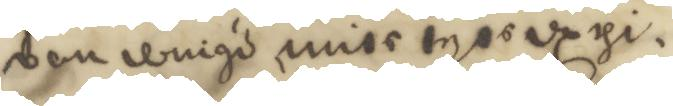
van eenige, mits tijts expi„
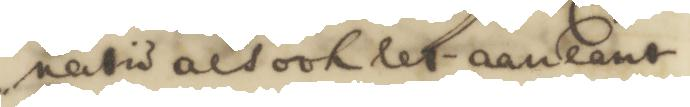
„ratie als ook het aan lant
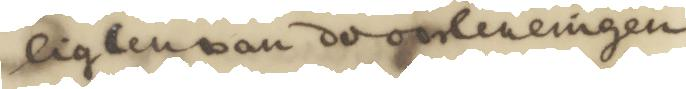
ligten van de oosterlingen
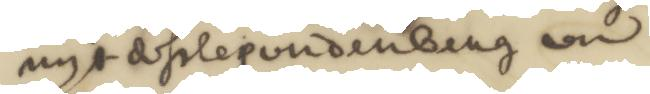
uyt deschependenberg en
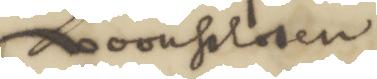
voorschoten
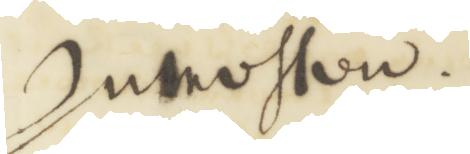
Jntresten
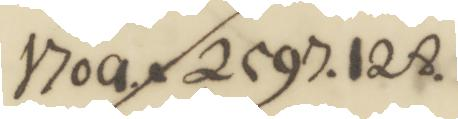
1704.ƒ2597.12 8.
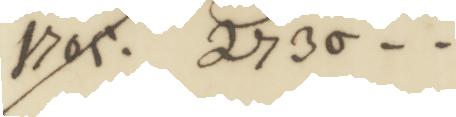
1705. 2730 - -
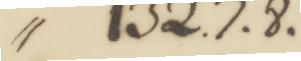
„ 132.7.8
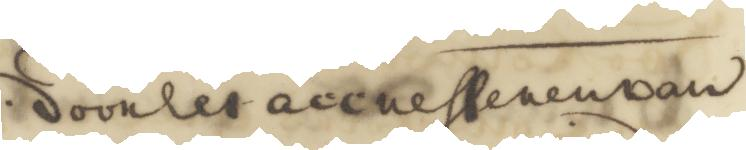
door het accresseren van
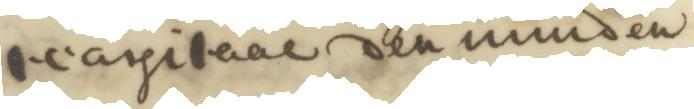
't capitaal der minder
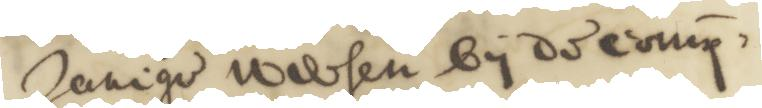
Jarige weesen bij de comp:
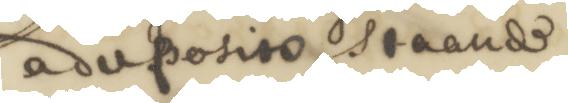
adeposito staande
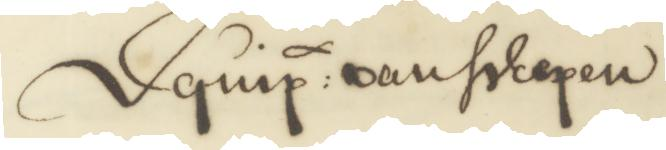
Equip: vanschepen
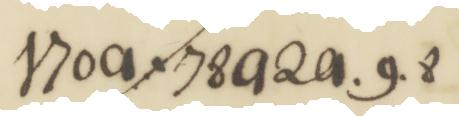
1704 ƒ78424. 9. 8
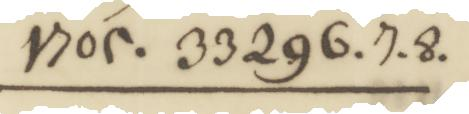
1705. 33296.7.8.
